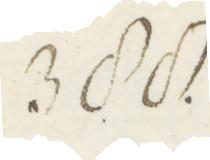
388.
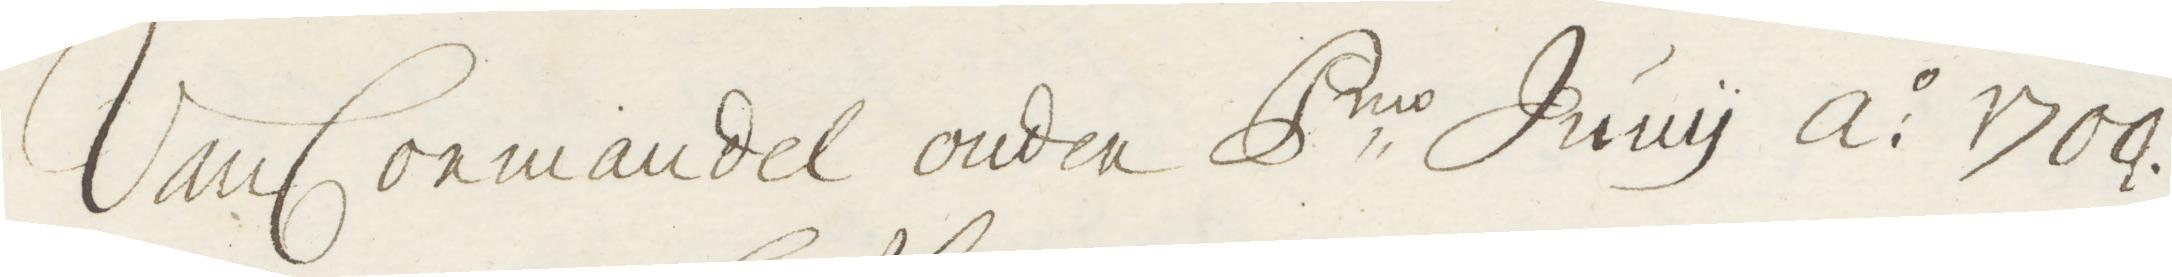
Van Cormandel onder P„mo Junij a:o 1704.
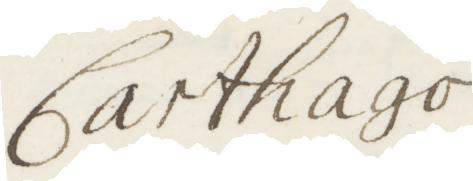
Carthago
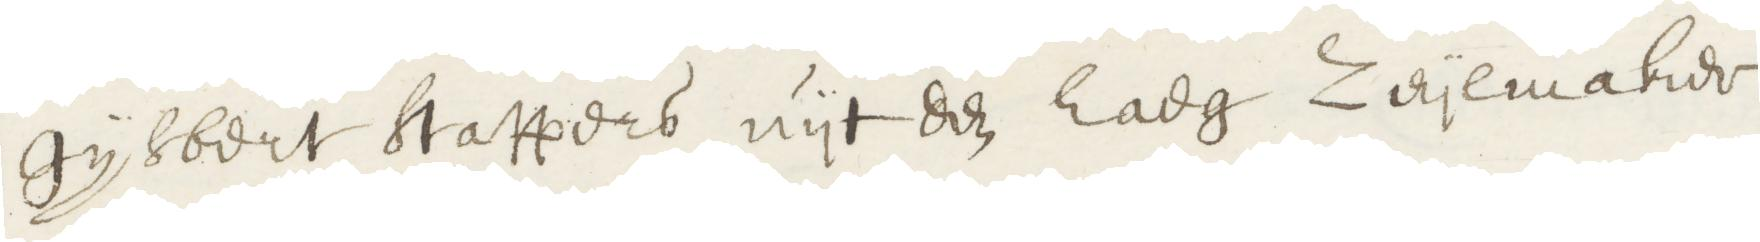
gijsbert stappers uijt den haeg zeijlmaker
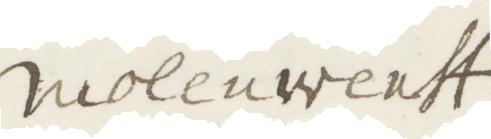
molenwerff
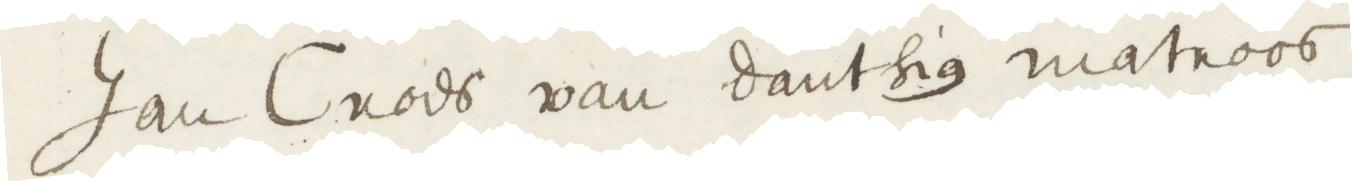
Jan Croes van dantsig matroos
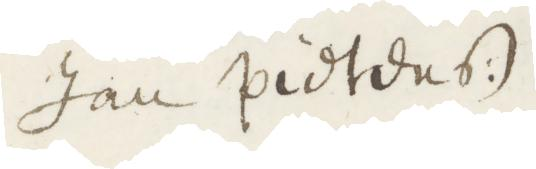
Jan pieters:
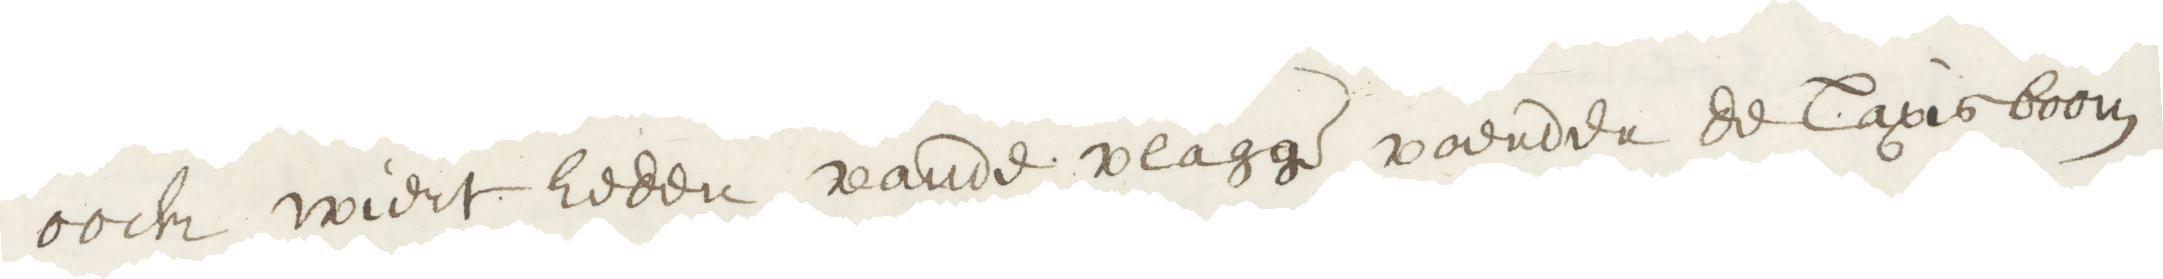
oock wiert heden vande vlagge voerder de Taxisboom
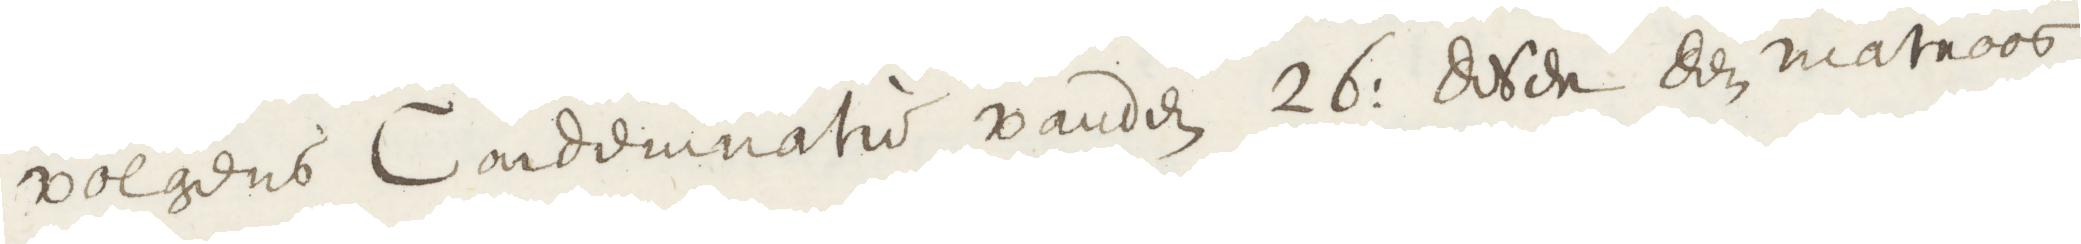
volgens Condemnatie vanden 26: deser den matroos
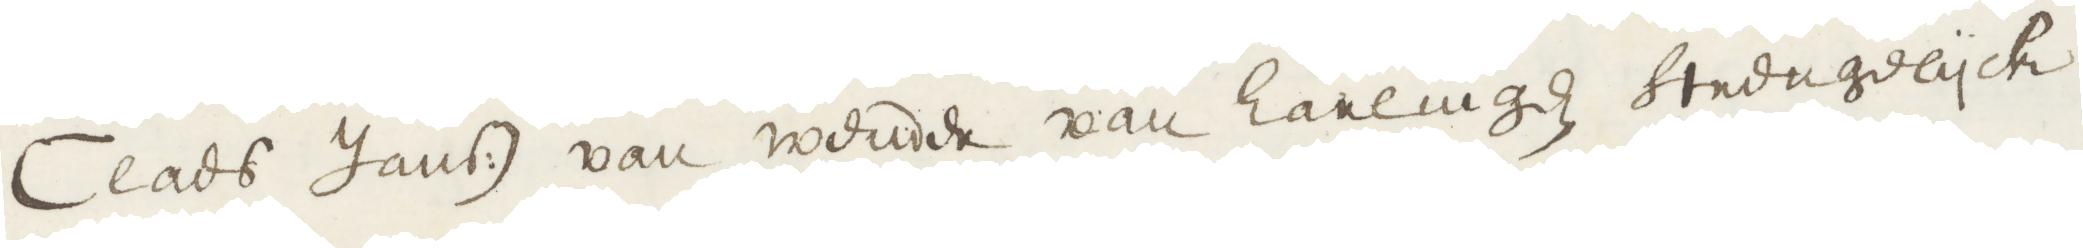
Claes Jans: van wender van harlingen strengelijck
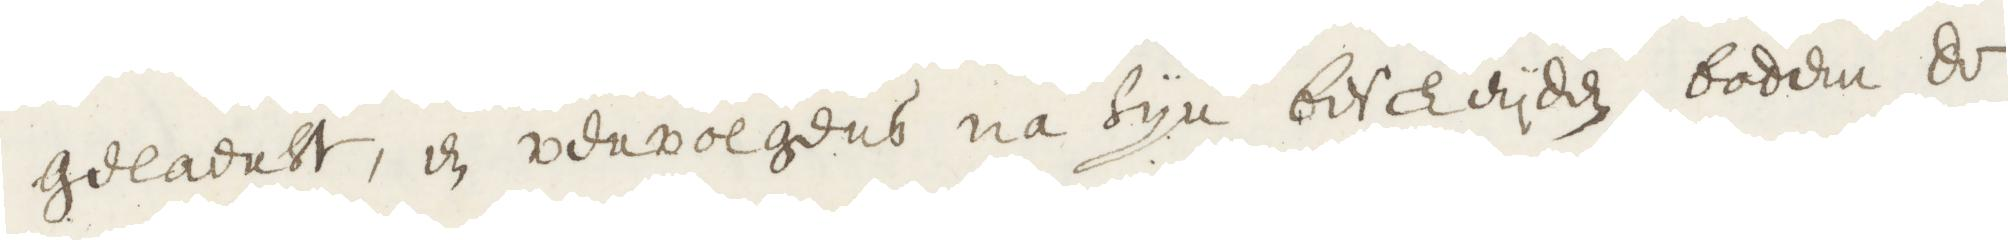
gelaerst, en vervolgens na sijn bescheijden bodem de
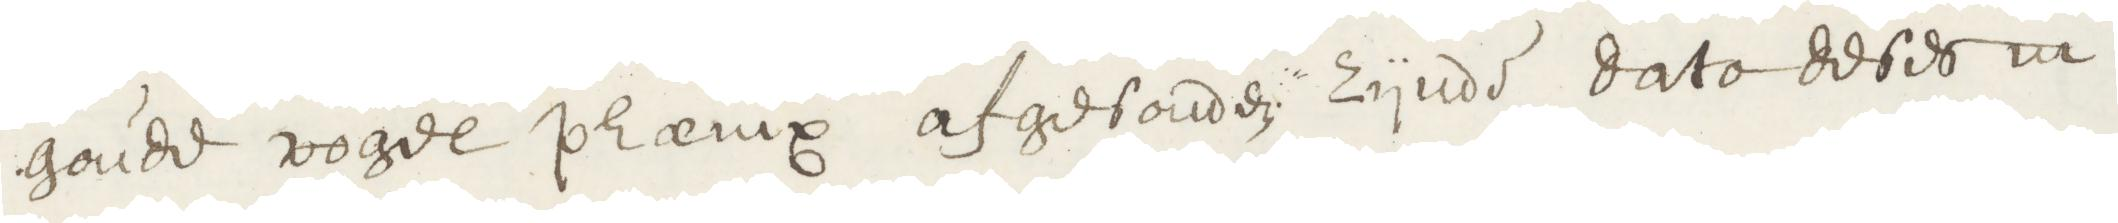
goude vogel phoenix afgesonden zijnde dato deses in
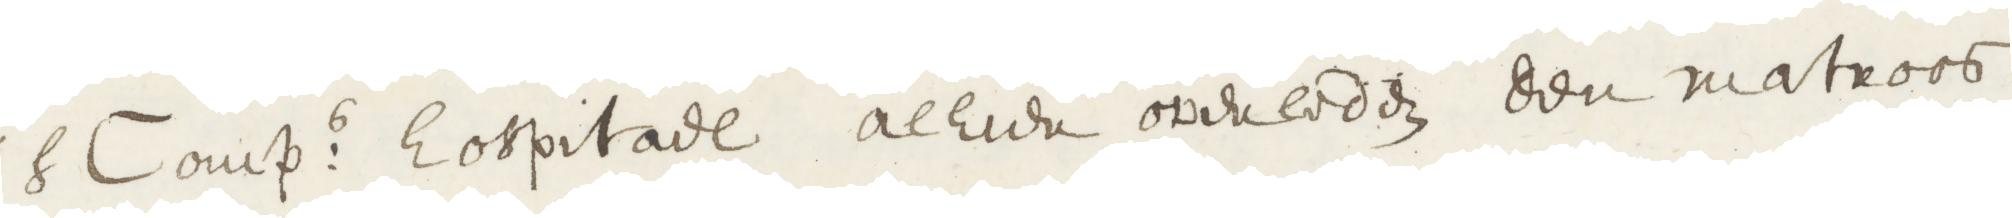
's Comp:s hospitael alhier overleden den matroos
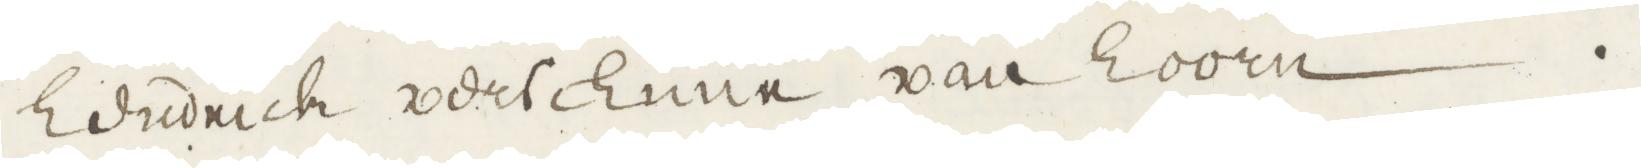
hendrick verschuur van hoorn.
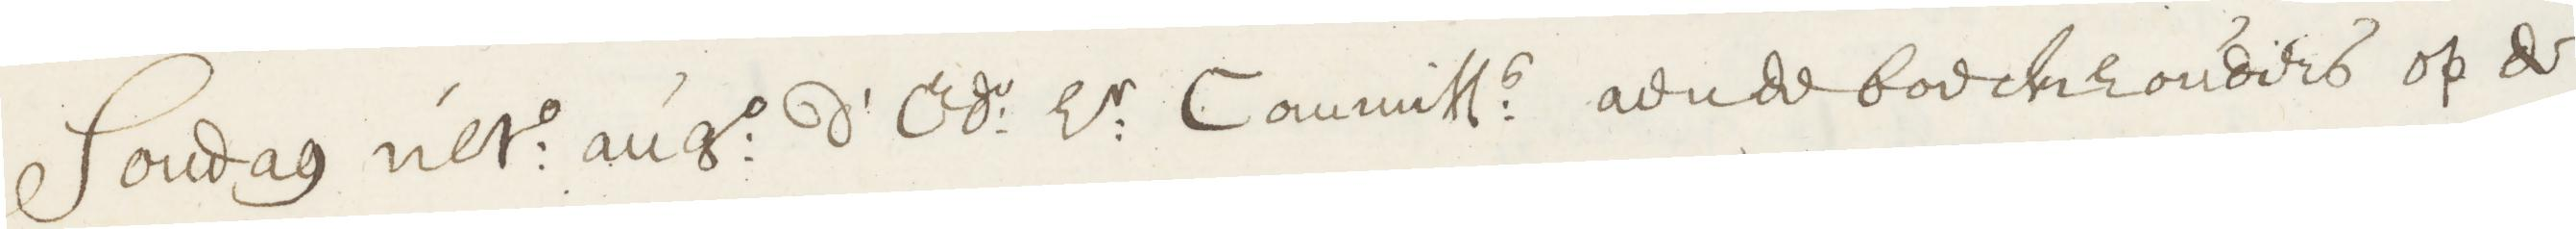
Sondag ult:o aug:o d’ Ed: h:r Commiss:s aende boeckhouders op de
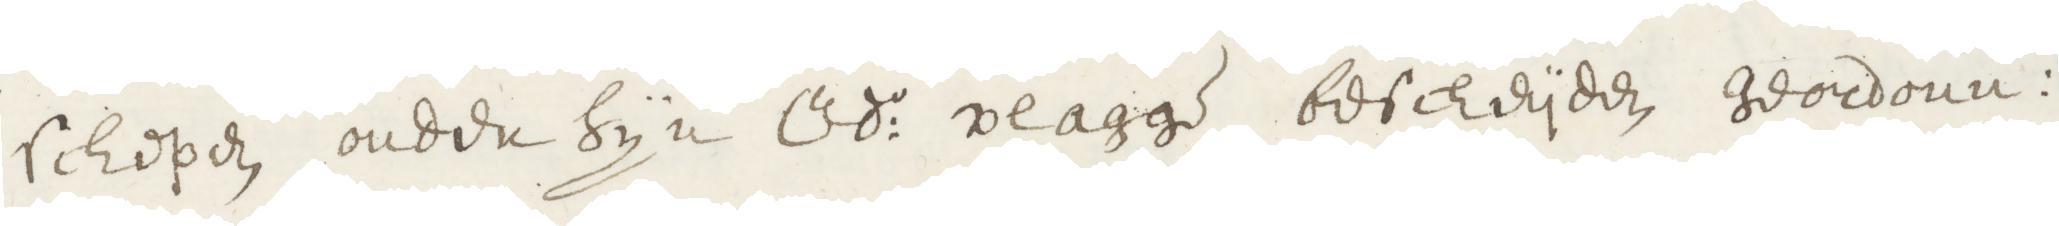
schepen onder sijn Ed: vlagge bescheijden geordonn:t
